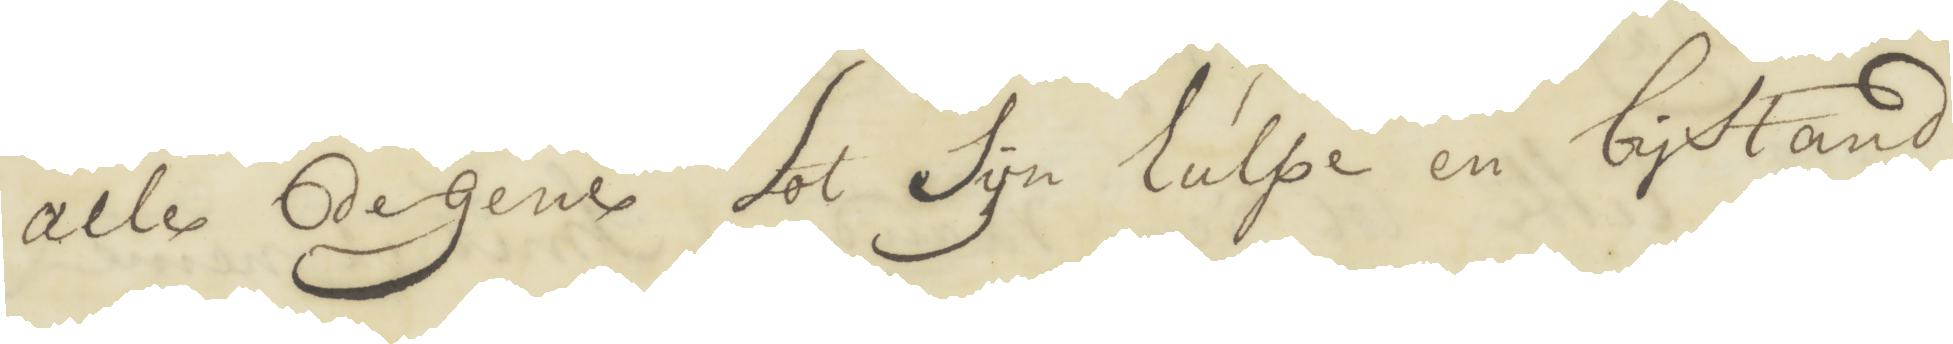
alle degene tot sijn hulpe en bijstand
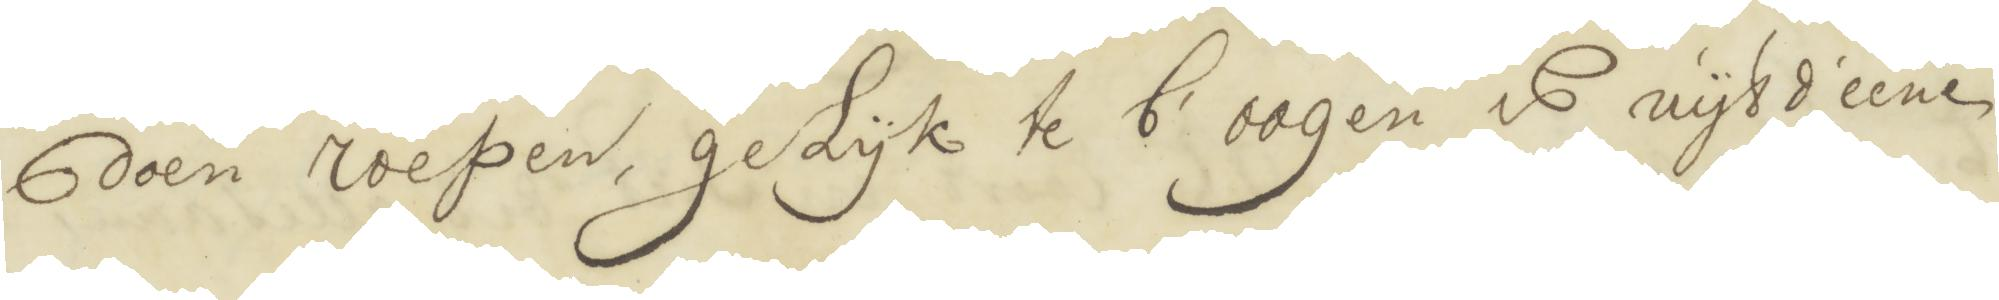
doen roepen, gelijk te b' oogen is uijt d'eene
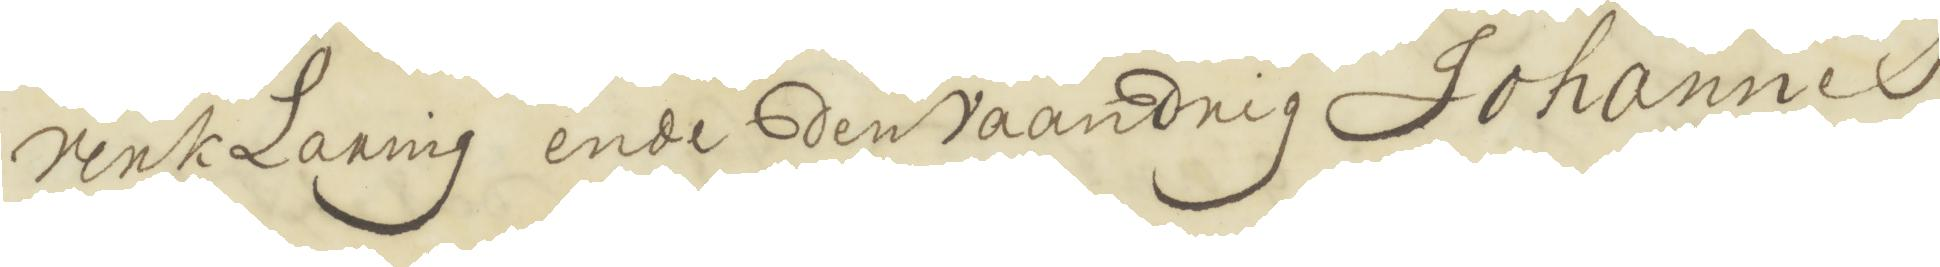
verklaring ende den vaandrig Iohannes
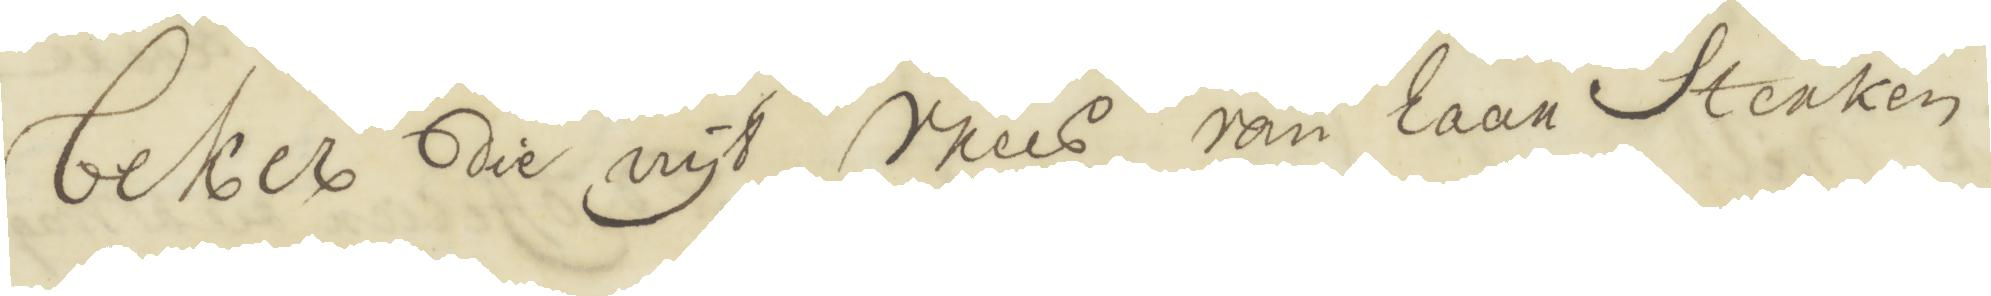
beker die uijt vrees van haar sterken
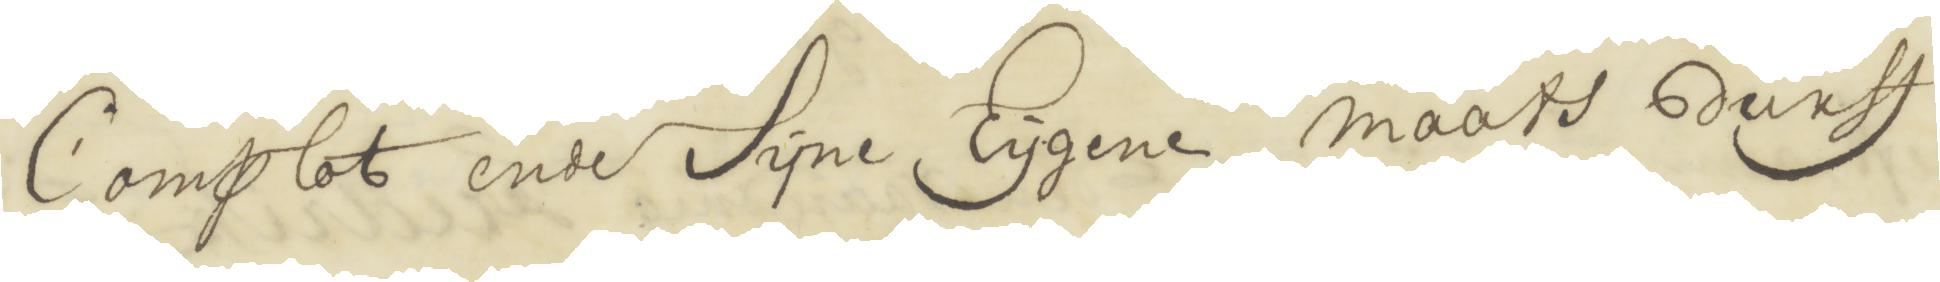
Complot ende sijne Eijgene maats durft
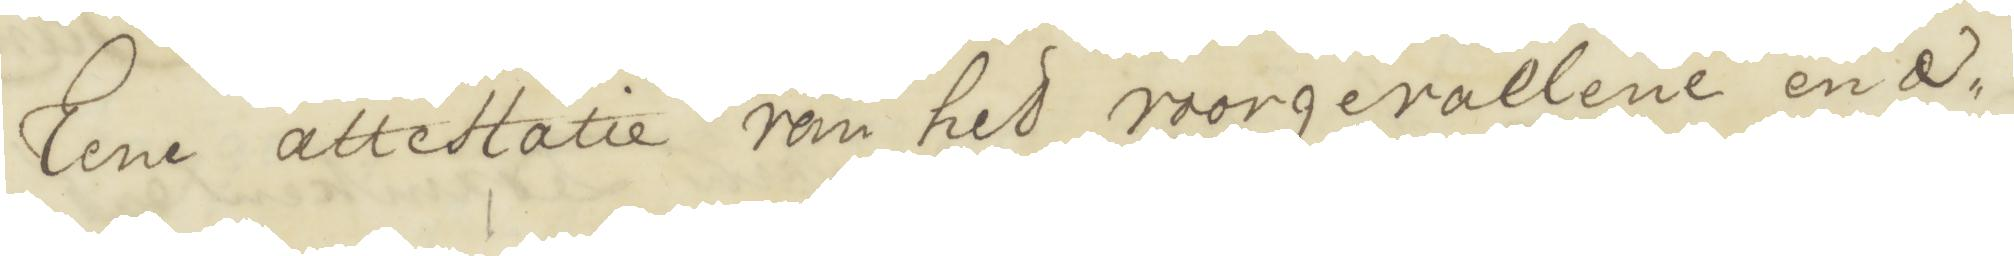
Eene attestatie van het voorgevallene en de„
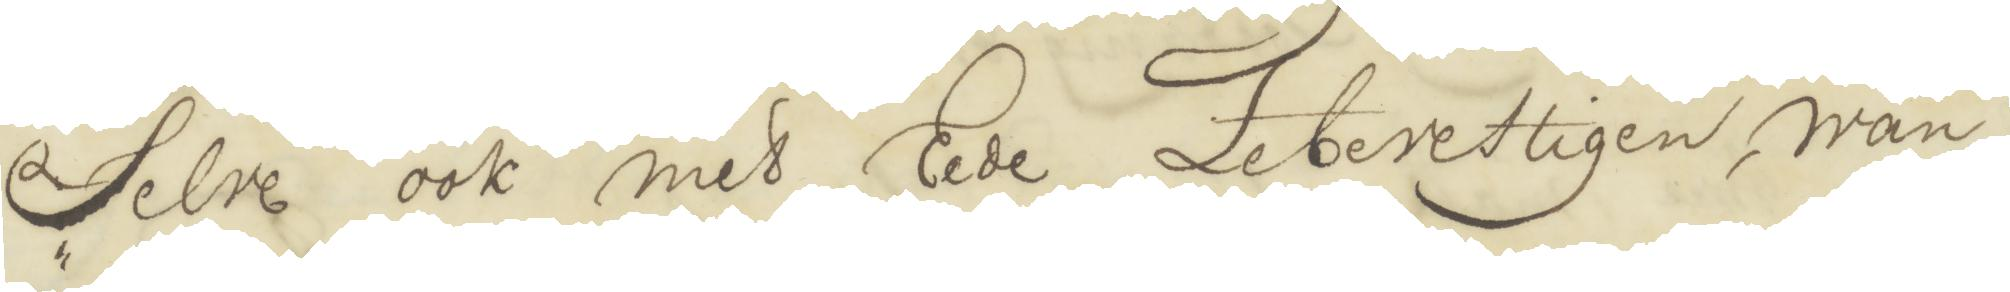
„selve ook met Eede te bevestigen, wan
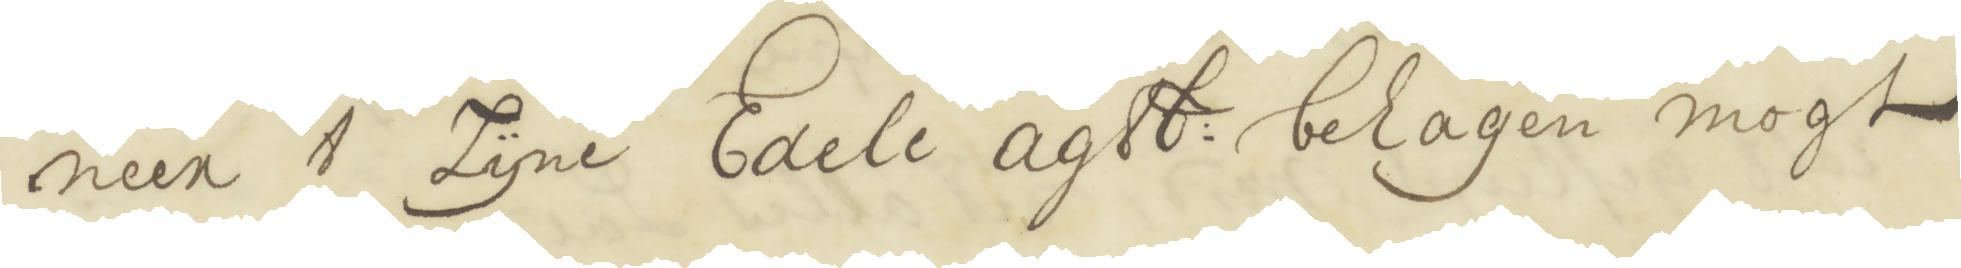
neer ’t zijne Edele agtb: behagen mogt
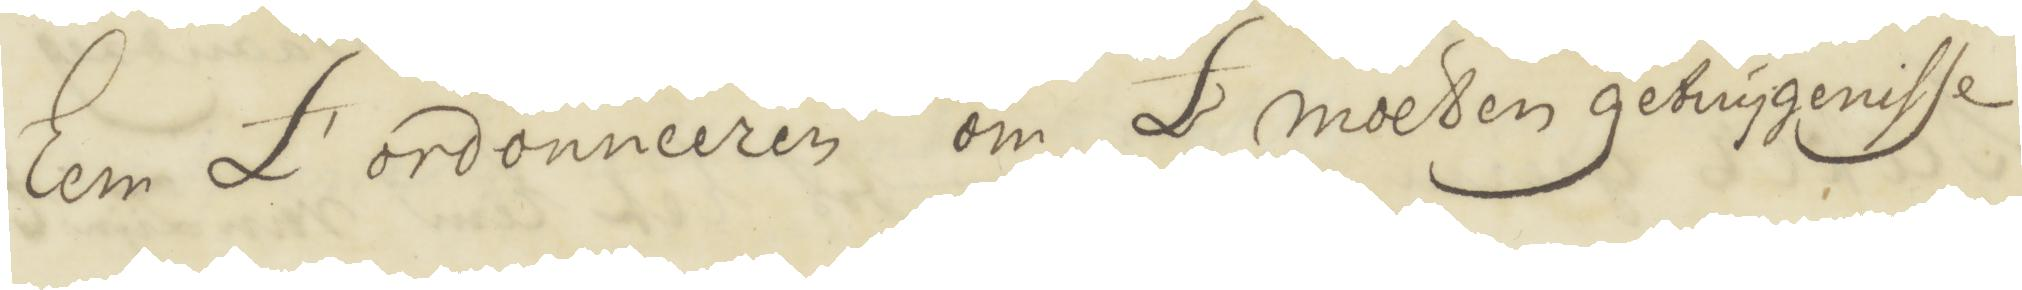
hem t' ordonneeren om te moeten getuijgenisse
